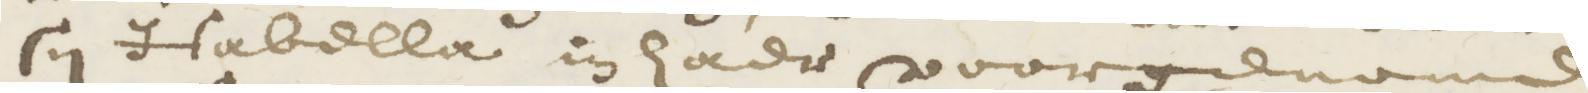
sy Isabella in haer voorgenoemen
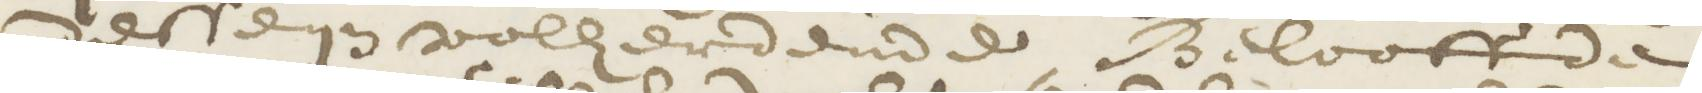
desseyn volhardende, Belooffde
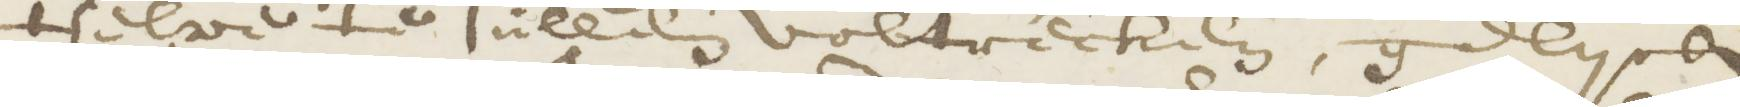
tselve te sullen voltrecken, gelyck
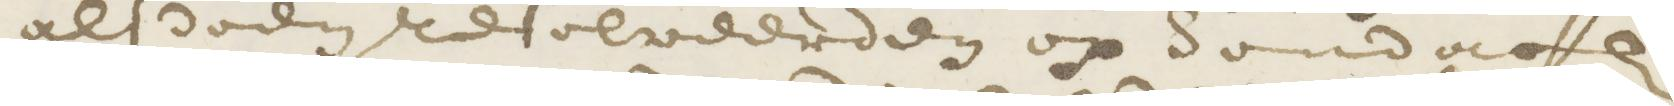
als doen resolveerden op sondach
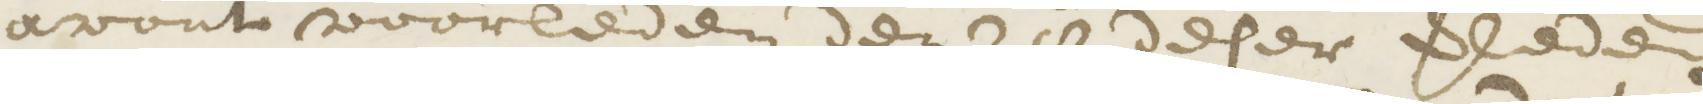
avont voorleden den 28 deser verleden
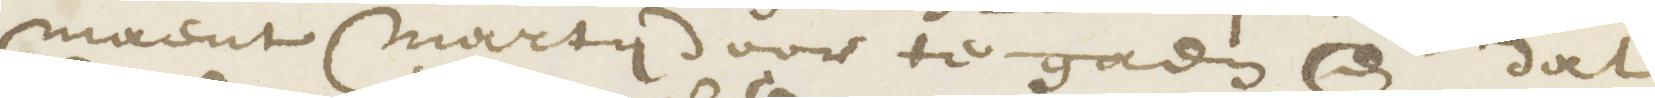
maent marty door te gaen ende dat
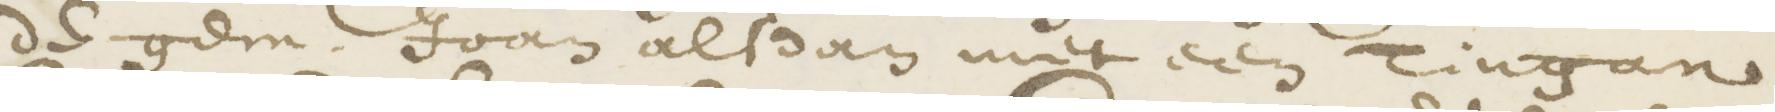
de gem. Ioan als dan met een tingan
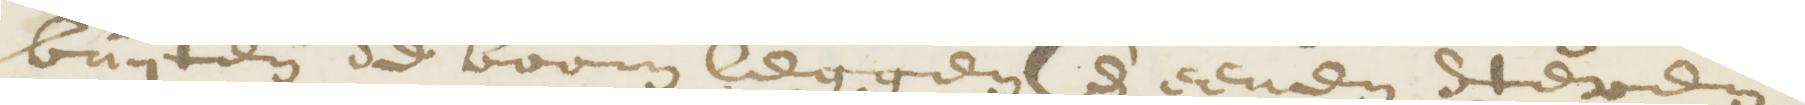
buyten de boom leggen ende eenen steven
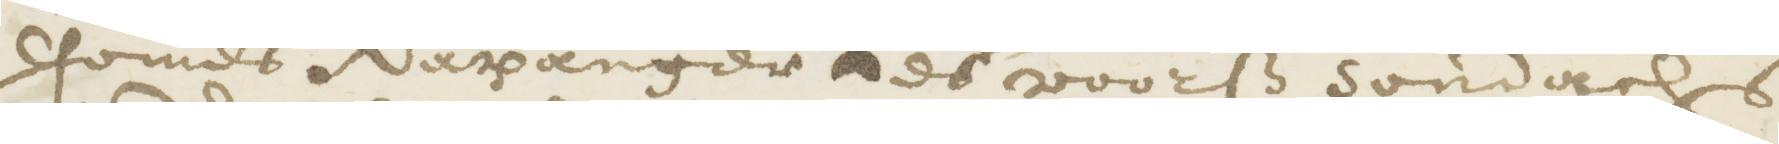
gomes paparger des voorsz sondachs
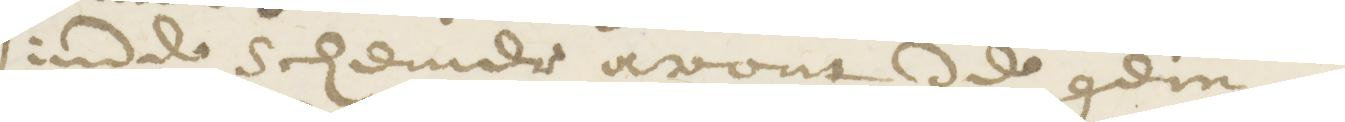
inde schemer avont de gem. s.ra
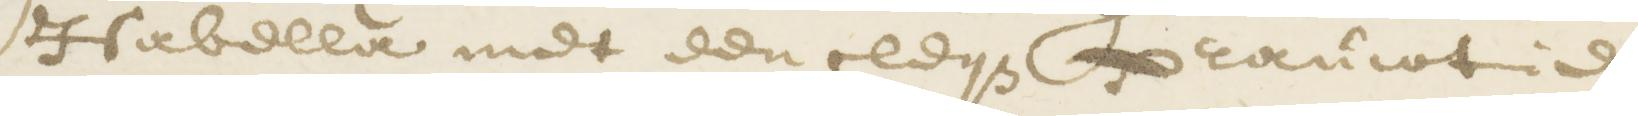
Isabella met een cleyn prauwtien
